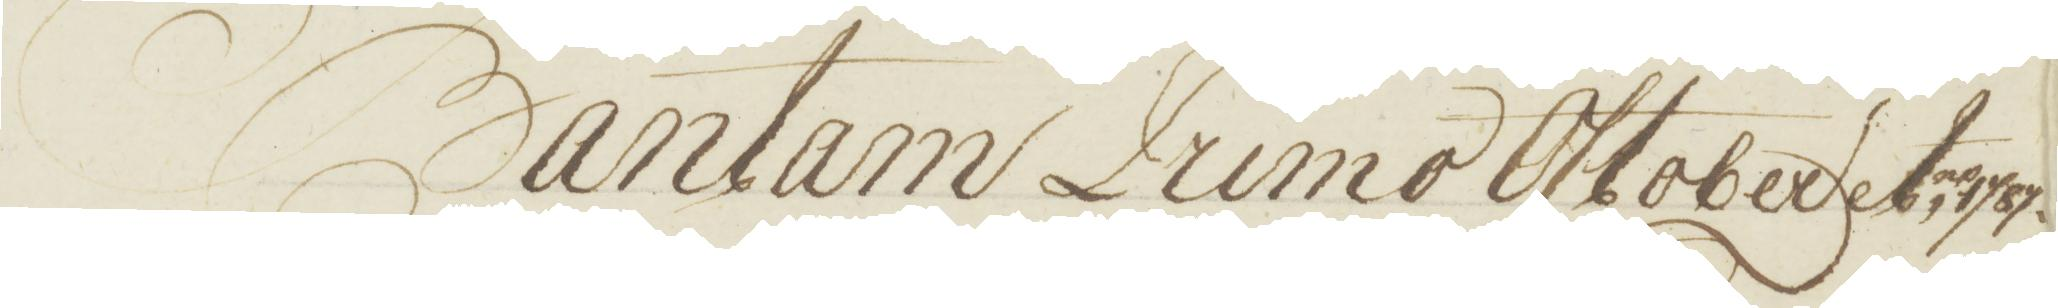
Bantam Primo October A„no 1787.
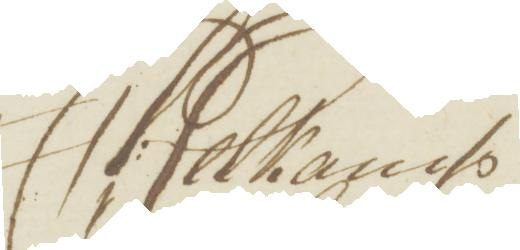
C:Telkamp
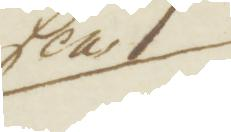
Scr.
